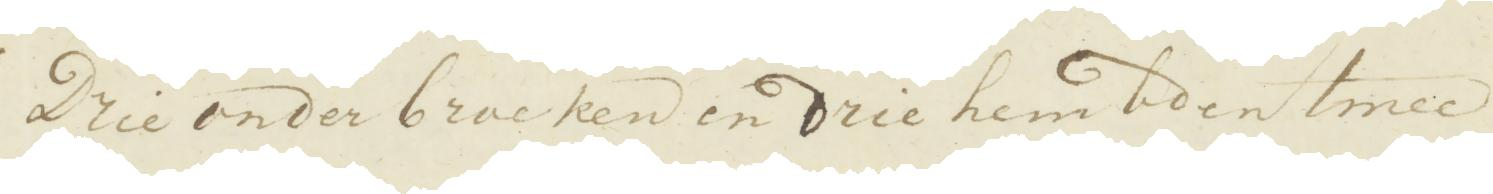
Drie onder broeken en drie hembden twee
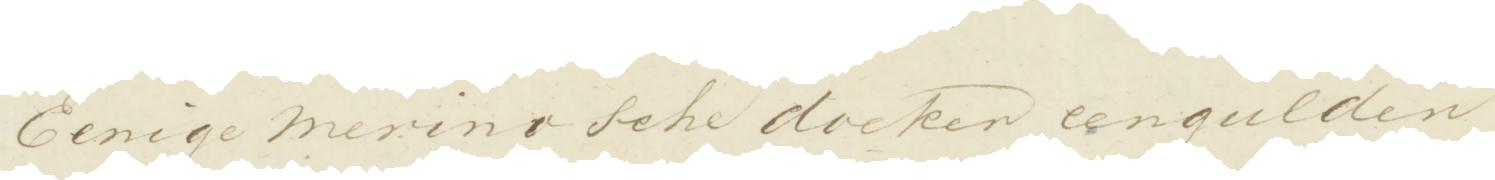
Eenige merinosche doeken een gulden
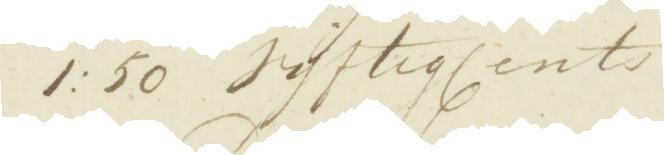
1: 50 vyftig cents
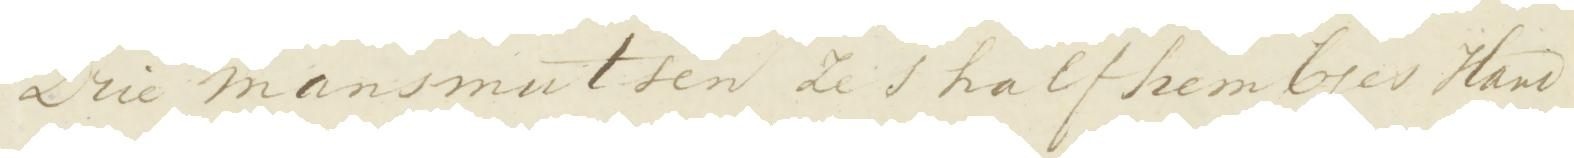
Drie mansmutsen zes halfhembjes Hand
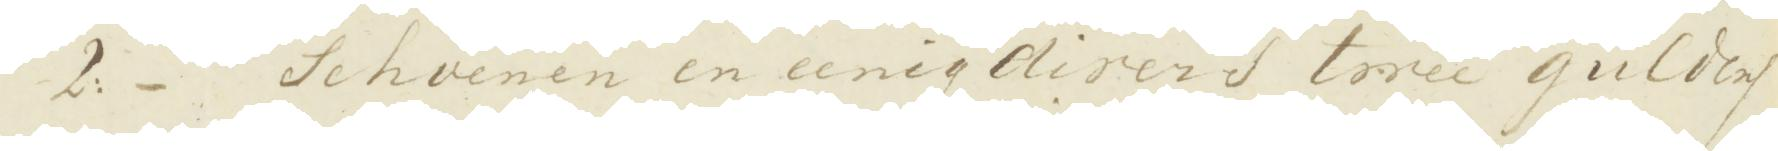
2: — schoenen en eenig divers twee guldens
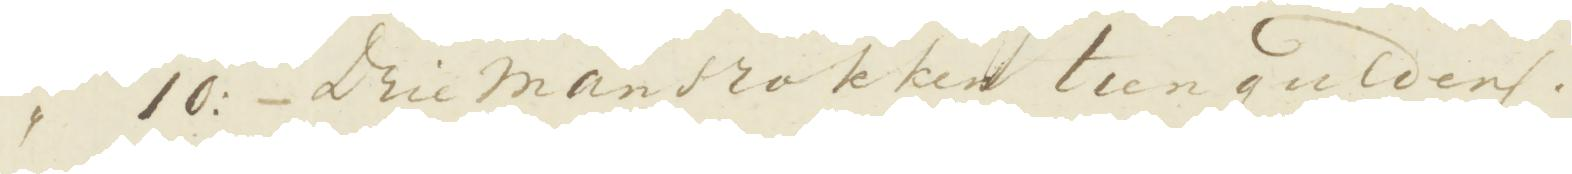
„ 10: — Drie mansrokken tien guldens.
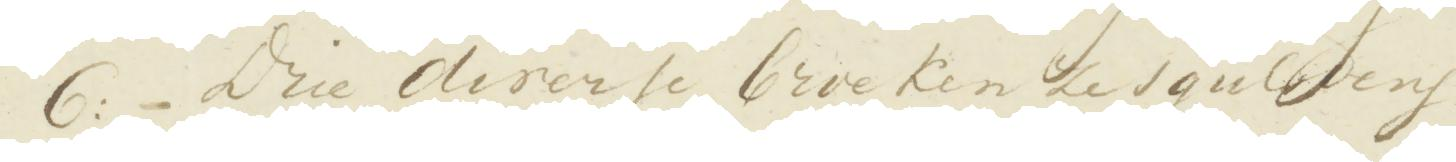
6: — Drie diverse broeken zes guldens
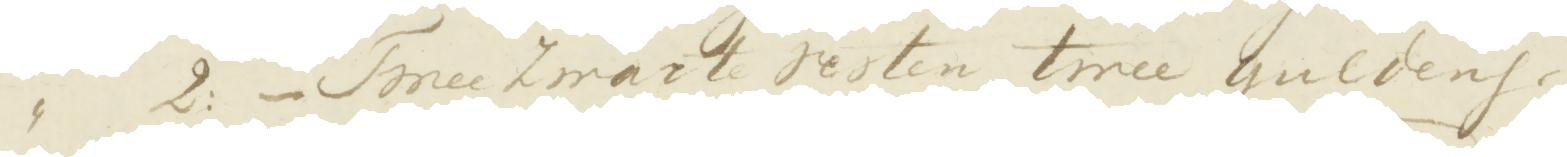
„ 2: — Twee zwarte vesten twee Guldens.
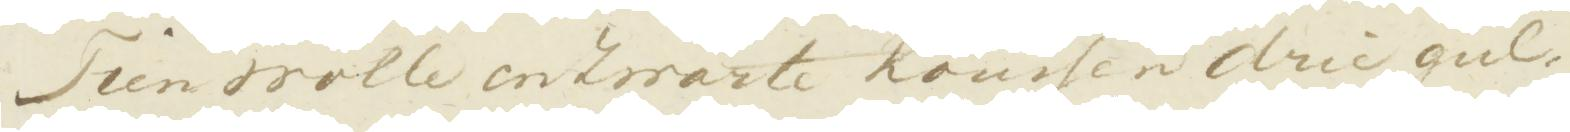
Tien wolle en zwarte koussen drie gul„
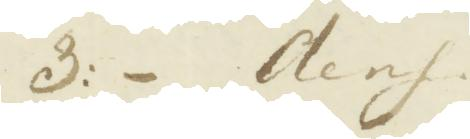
3: — dens.
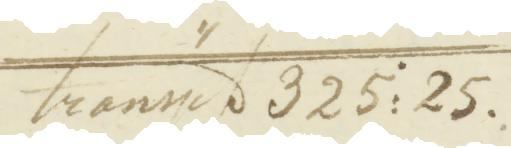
transp ƒ325:25.
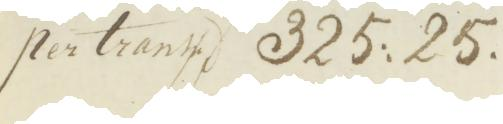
per transp ƒ 325: 25.
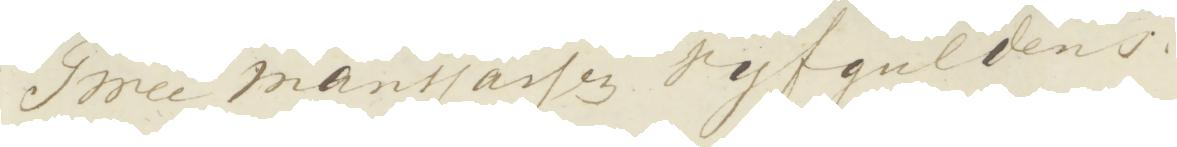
Twee mansjassen vyf guldens.
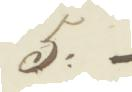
5: -
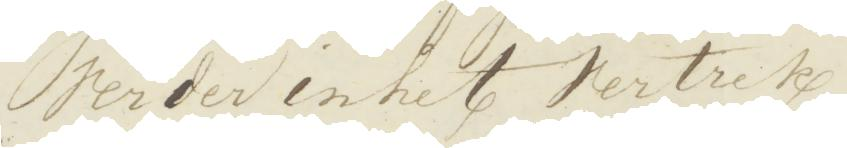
verder in het vertrek
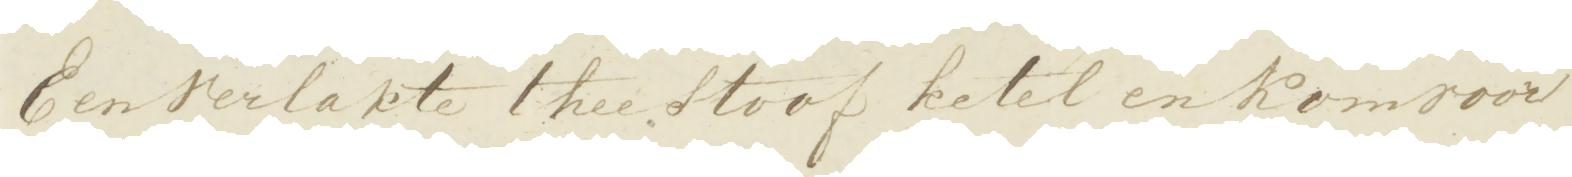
Een verlakte thee stoof ketel en komvoor
